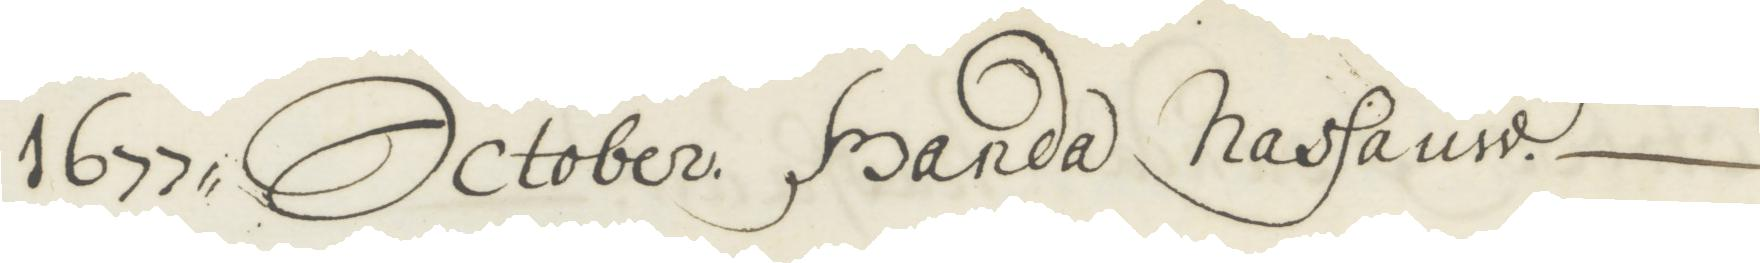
1677„ October. Banda Nassauw. —
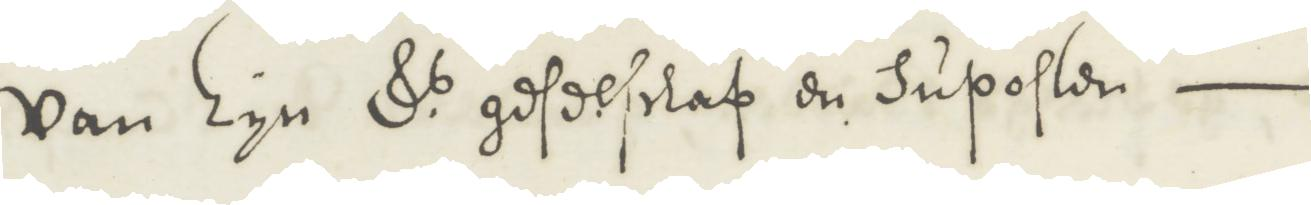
van zijn E:s geselschap en suposten —
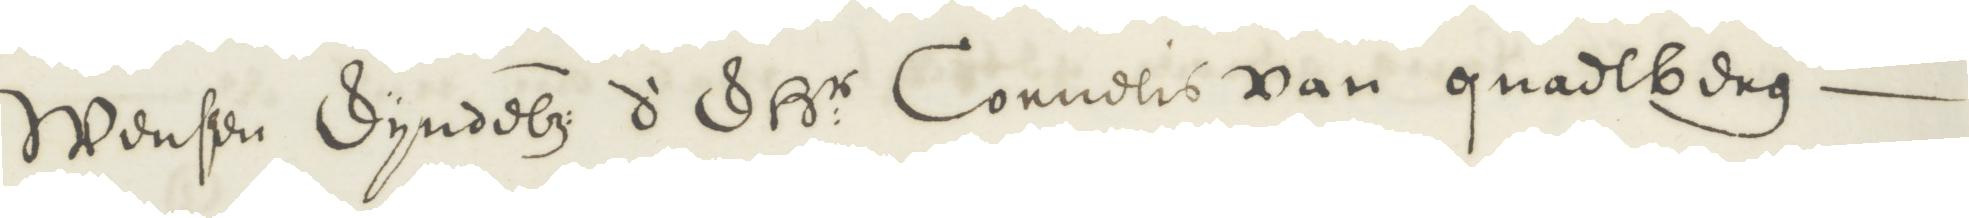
Wensen Eijndelijk d’ E H:r Cornelis van quaelberg —
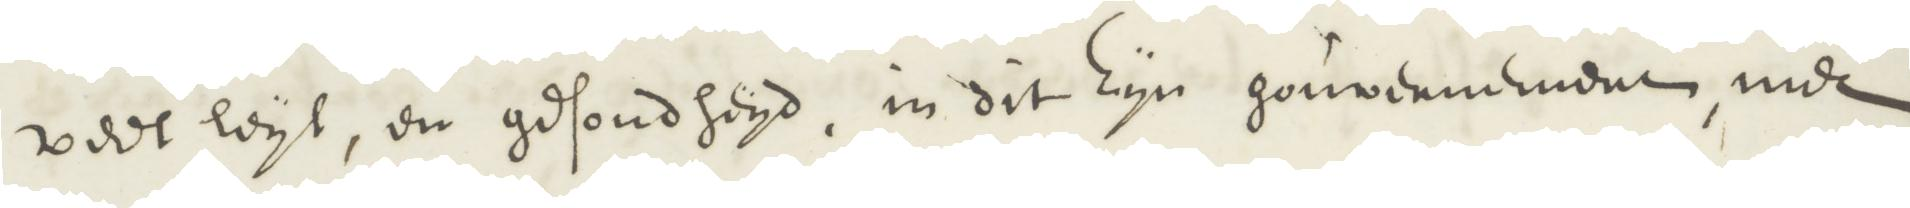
veel heijl, en gesondheijd, in dit zijn gouvernement, met
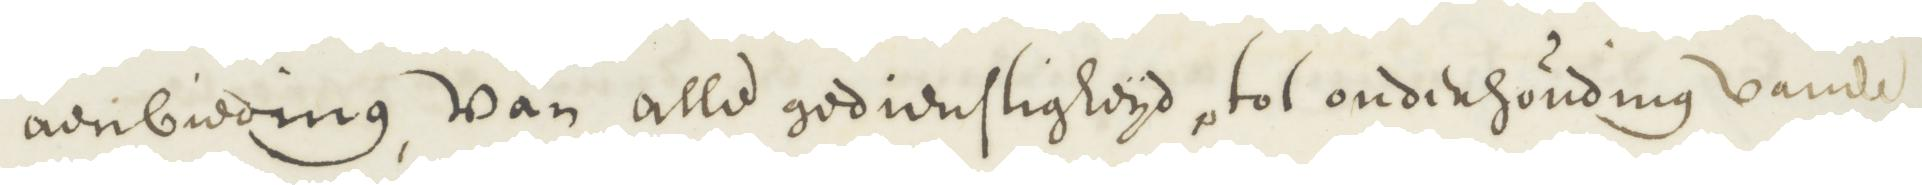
aenbieding, van alle gedienstigheijd, tot onderhouding vande
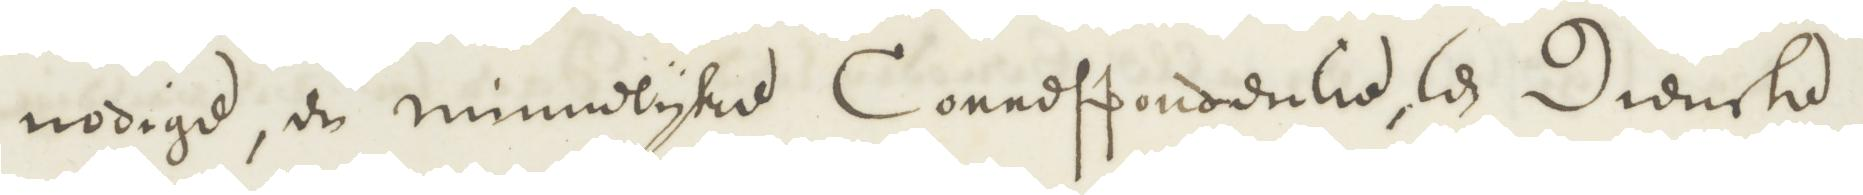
nodige, en minnelijke Correspondentie, ten Dienste
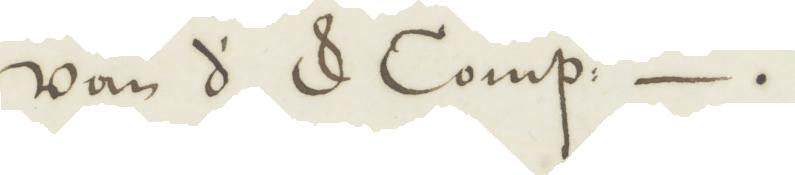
van d’ E Comp:e —.
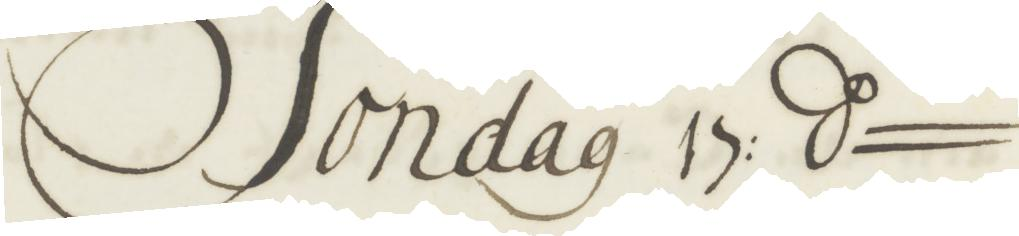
Sondag 17: d=o
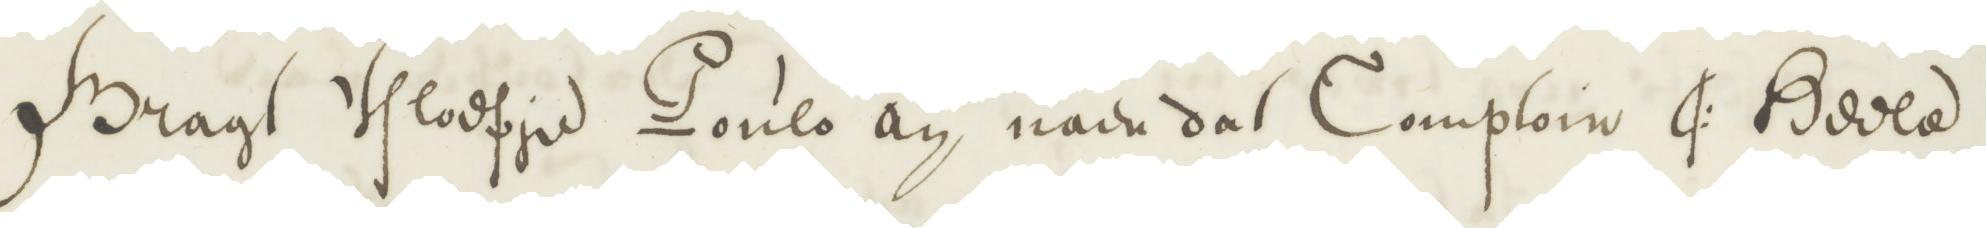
Bragt 'tsloepje Poulo aij naer dat Comptoir 4: Heele
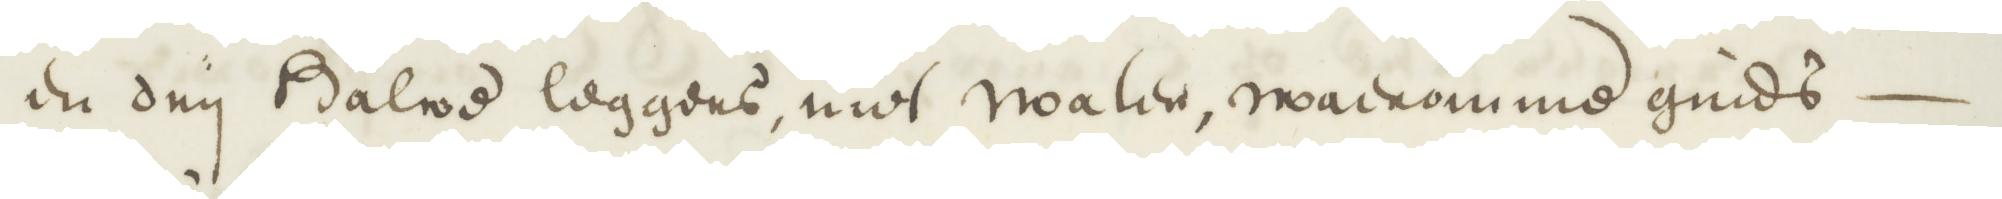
en drij Halve leggers, met water, waeromme ginds —
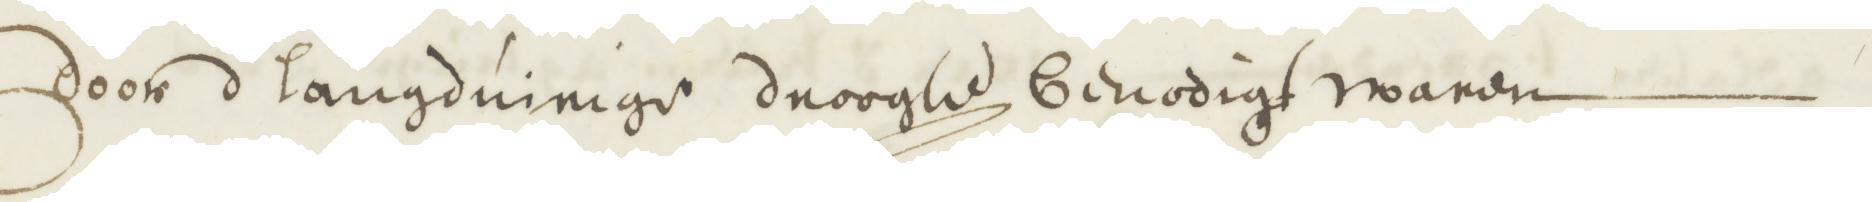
door d' langduirige droogte benodigt waren, —
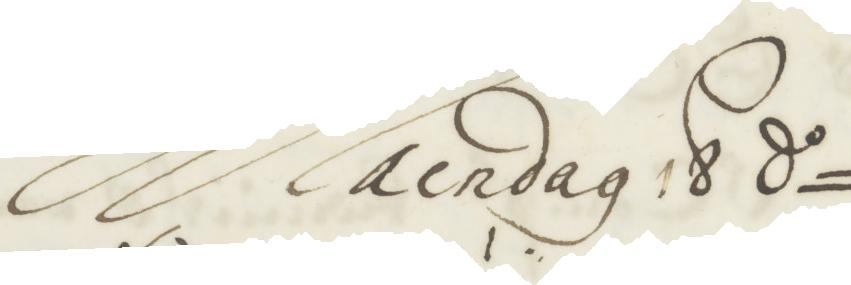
Maendag 18 d=o
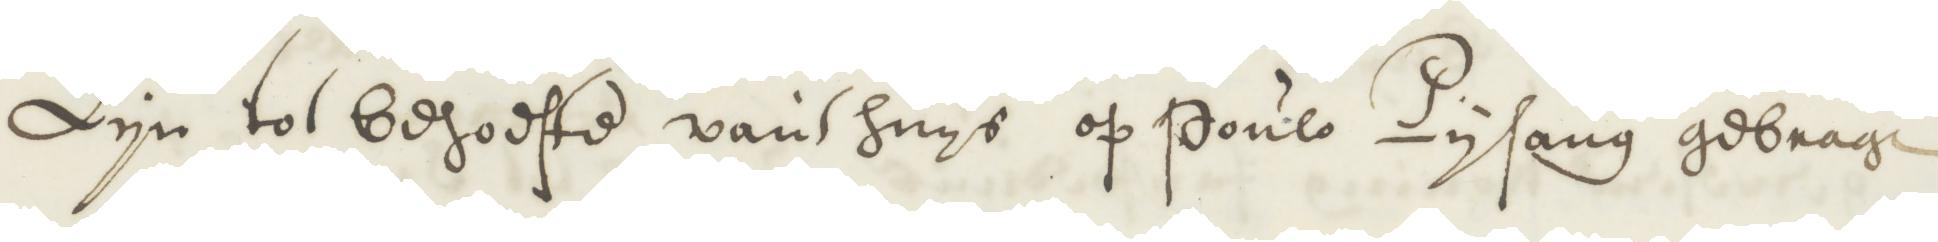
zijn tot behoefte van 't huijs op poulo Pijsang gebragt
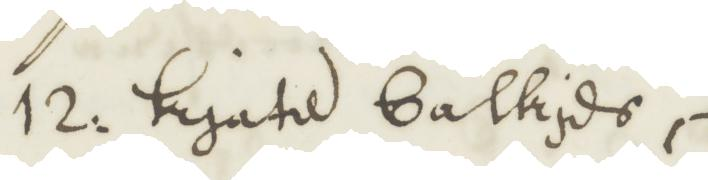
12: kjate balkjes, —
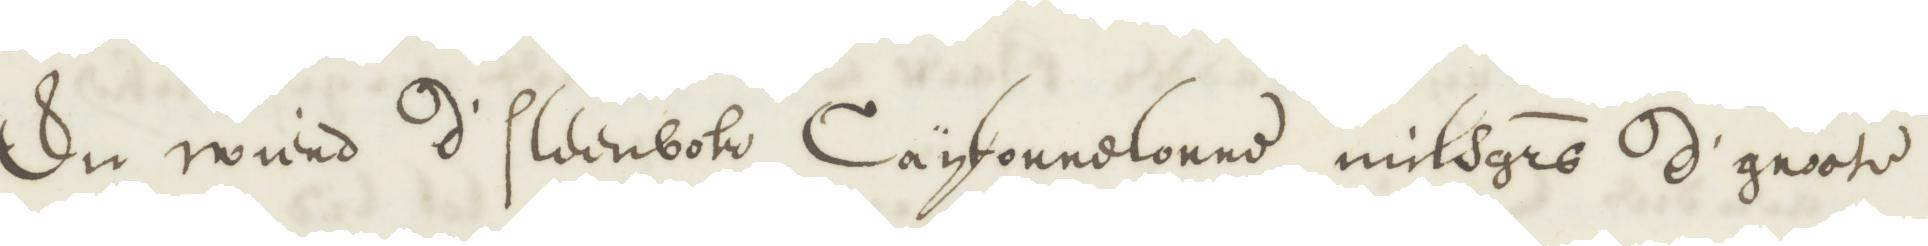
En wierd d’ steenbok Caijtorretorre mitsgrs d’ groote
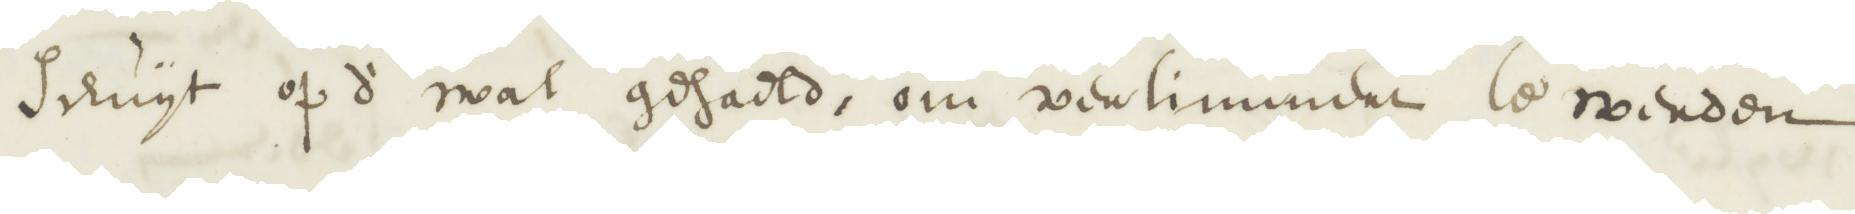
schuijt op d’ wal gehaeld, om vertimmert te werden
